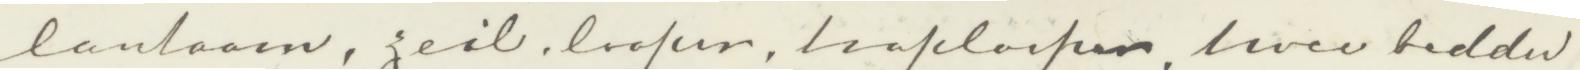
lantaarn, zeil, looper, traplooper, twee bedden
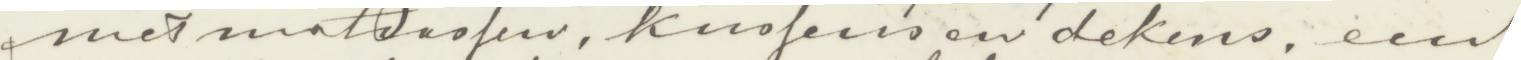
met matrassen, kussens en dekens, een
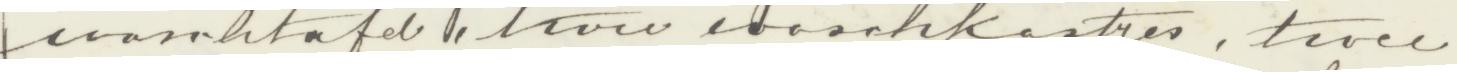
waschtafel, twee waschkastjes, twee
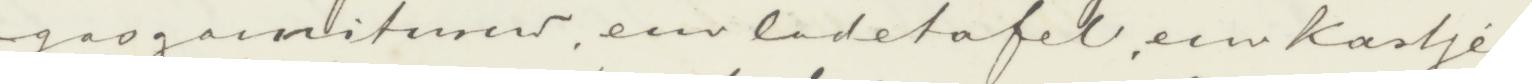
gasgarnituren, een ladetafel, een kastje
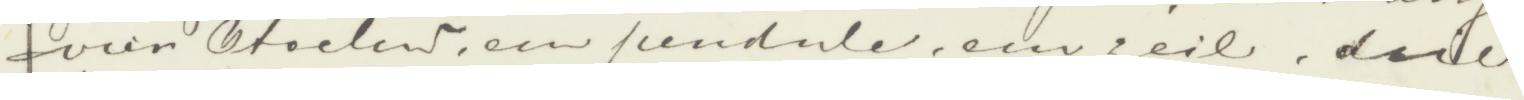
vier stoelen, een pendule, een zeil, drie
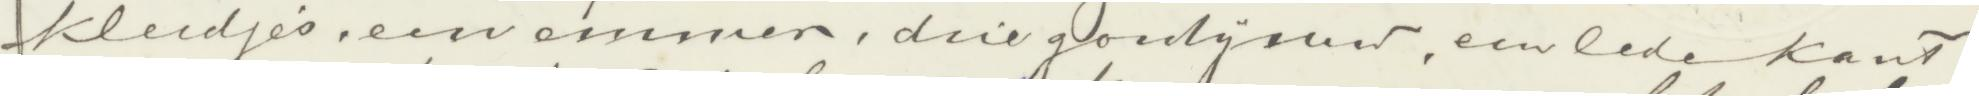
kleedjes, een emmer, drie gordijnen, een ledekant
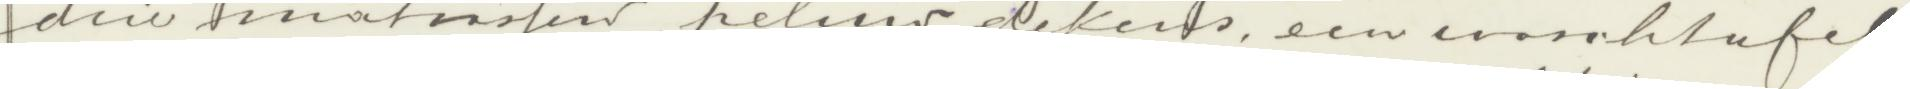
drie matrassen, peluw, dekens, een waschtafel
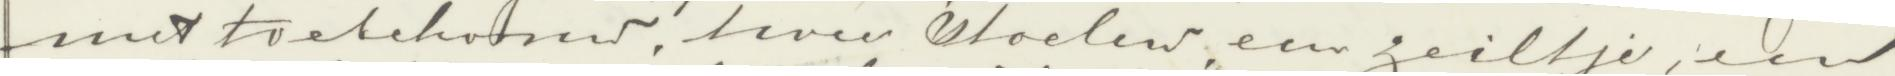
met toebehooren, twee stoelen, een zeiltje, een
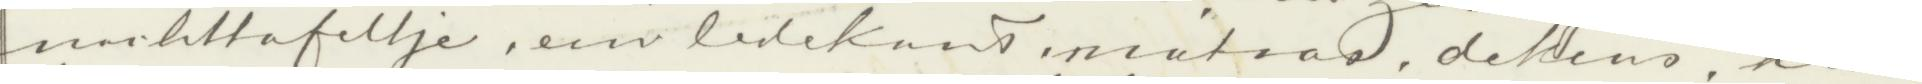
nachttafeltje, een ledekant, matras, dekens, kus
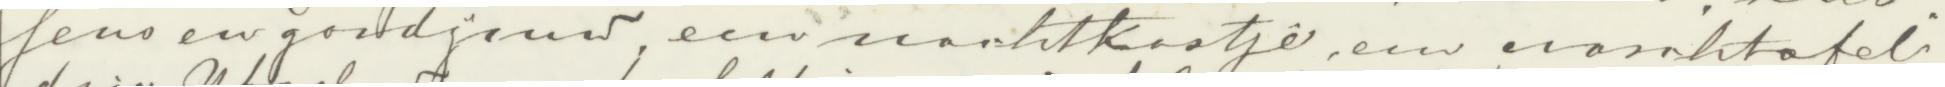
sens en gordijnen, een nachtkastje, een waschtafel
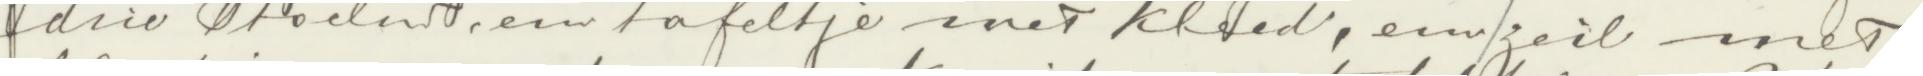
drie stoelen, een tafeltje met kleed, een zeil met
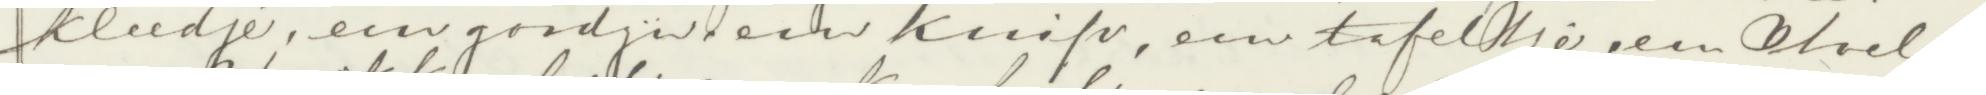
kleedje, een gordijn, een kastje, een tafeltje, een stoel,
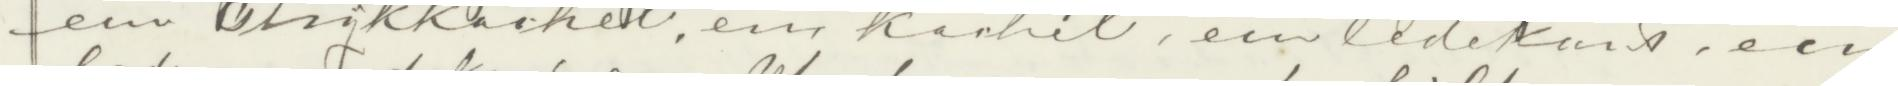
een strijkkachel, een kachel, een ledekant, een
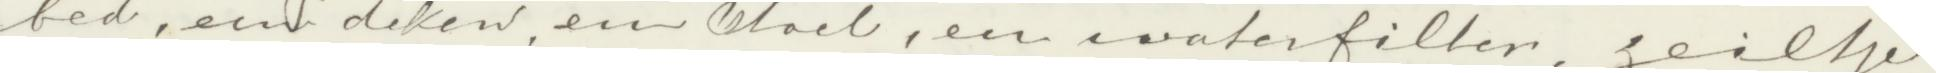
bed, een deken, een stoel, een waterfilter, zeiltje
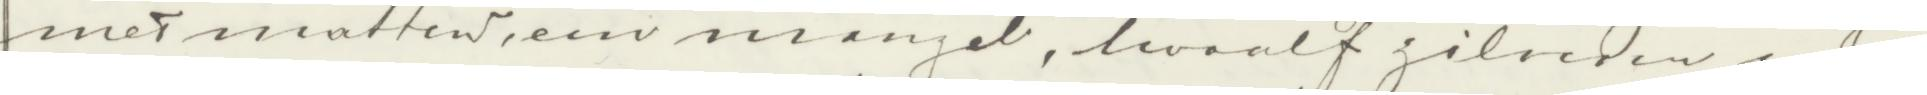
met matten, een mangel, twaalf zilveren vor.
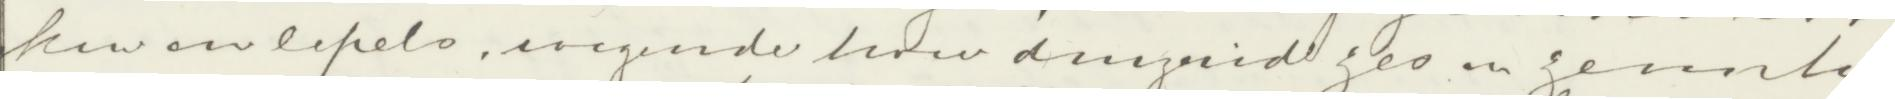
ken en lepels, wegende twee duizend zes en zeventig
